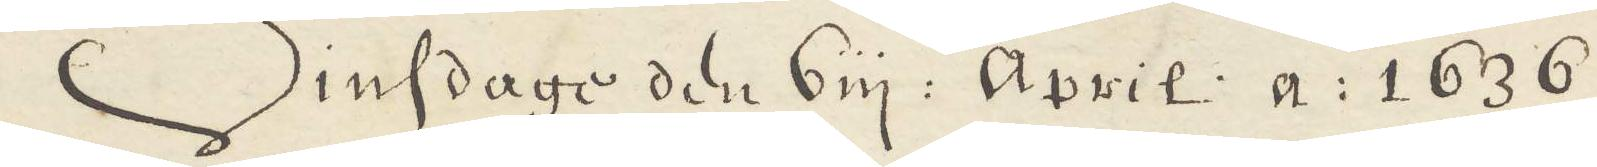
Dinsdage den viij:en april: a:o 1636
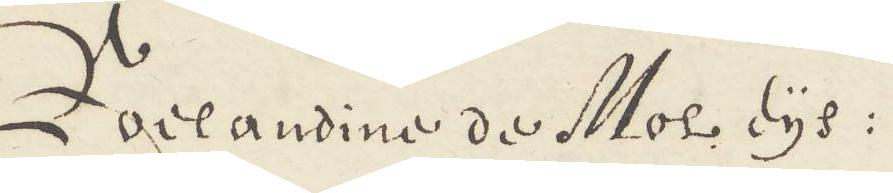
Roelandine de Mol eijs:rse
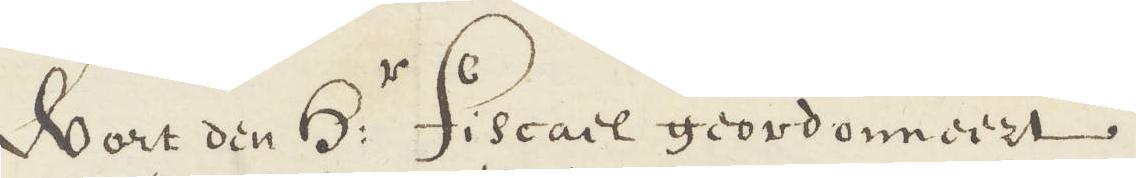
Wort den h:r fiscael geordonneert
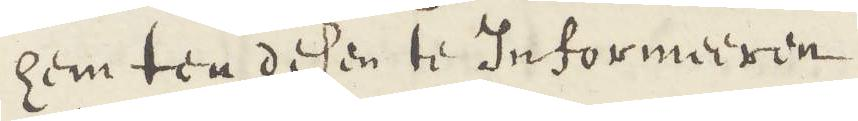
hem ten desen te Informeeren
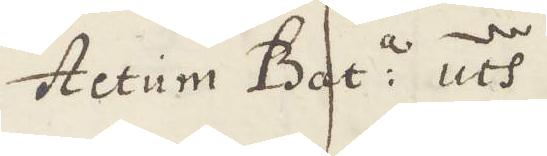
Actum Bat:a uts
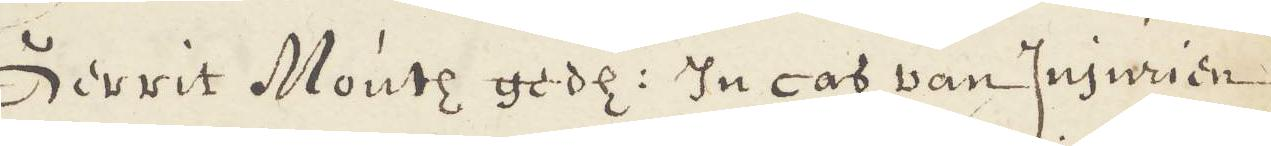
Gerrit Mouth gedh:e In cas van Jnjurien
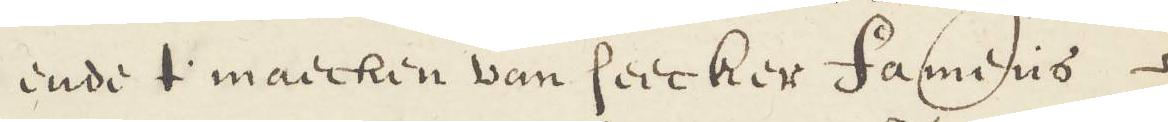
ende t' maecken van seecker fameus
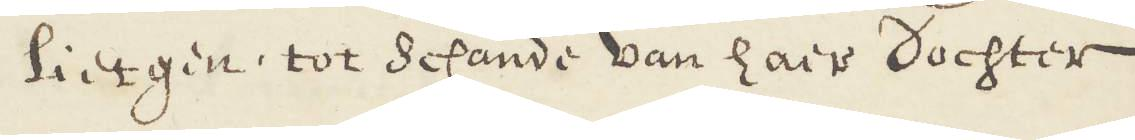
lietgen, tot schande van haer dochter
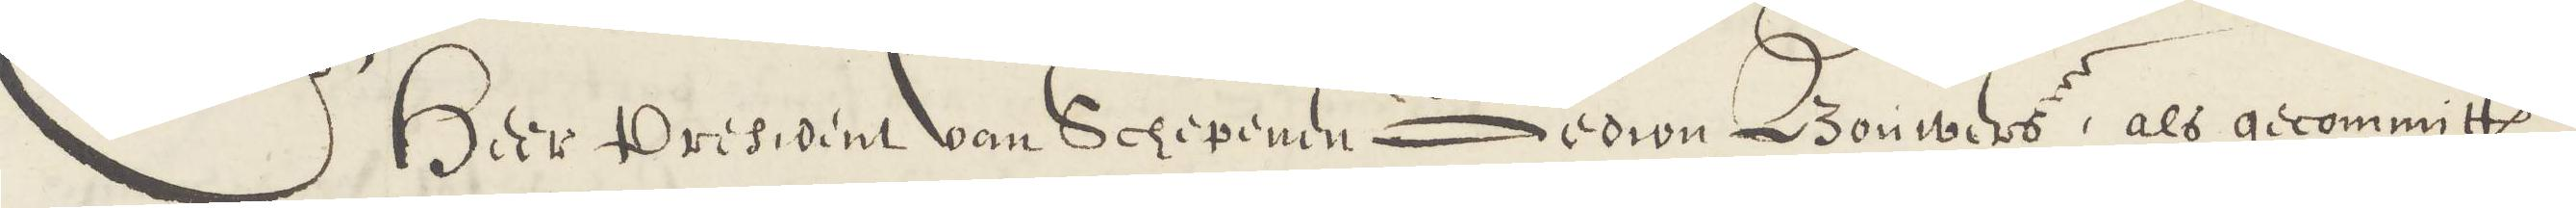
D'Heer President van Schepenen Gedion Bouwers, als gecommitt:de
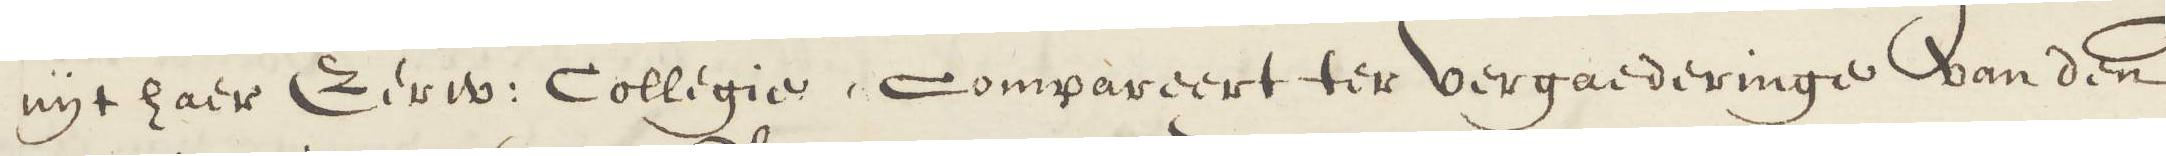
uijt haer Eerw: Colligie, compareert ter vergaederinge van den
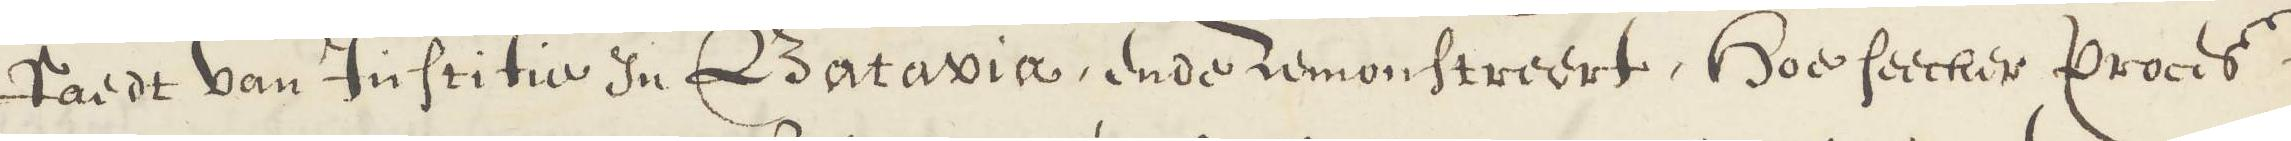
Raedt van Iustitie In Batavia, ende remonstreert, hoe seecker proces
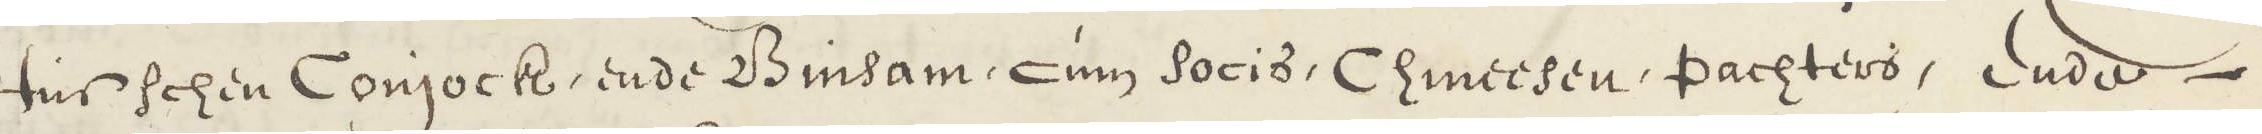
tusschen Conjock, ende Binsam, cum socis, Chineesen, pachters, ende —
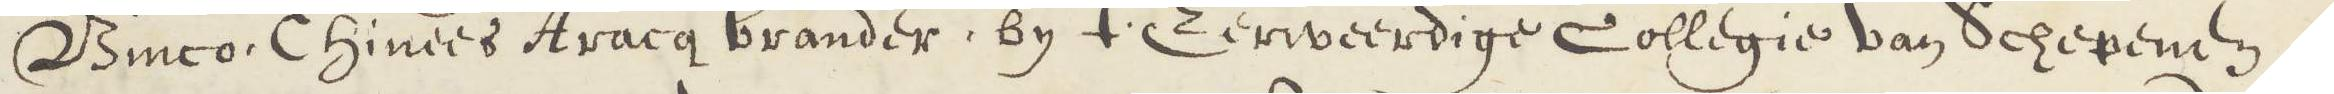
Binco, Chinees Aracq brander, bij t' Eerweerdige collegie van schepenen –
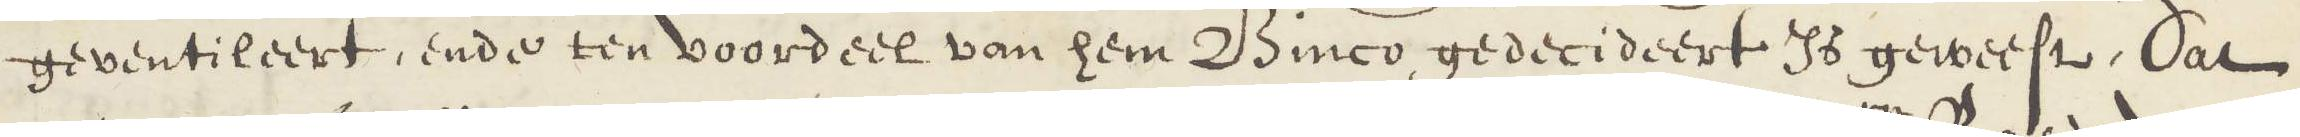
geventileert, ende ten voordeel van hem Binco gedecideert Is geweest, Dat
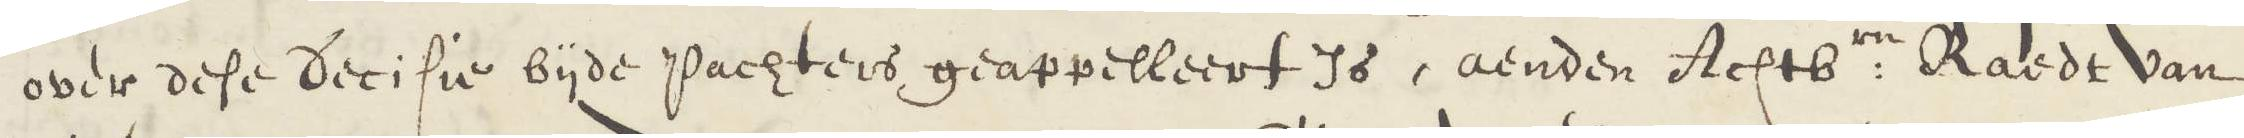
over dese decisie bij de pachters geappelleert Is, aenden Achtb:rn Raedt van
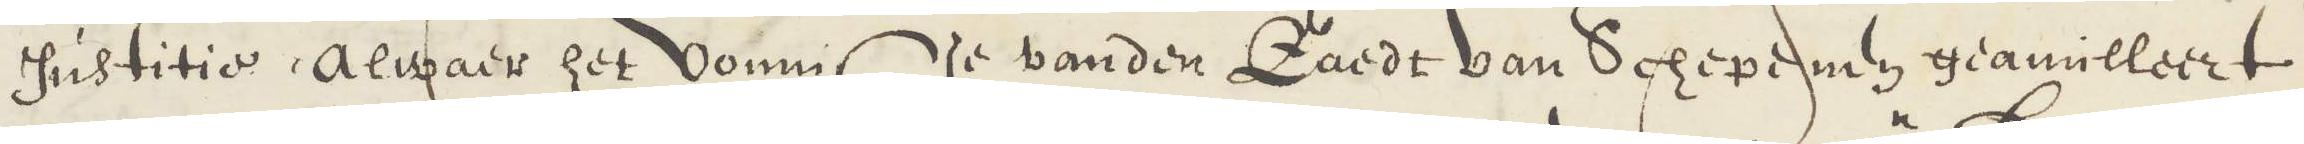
Justitie alwaer het vonnisse van den Raedt van schepenen geamilleert
